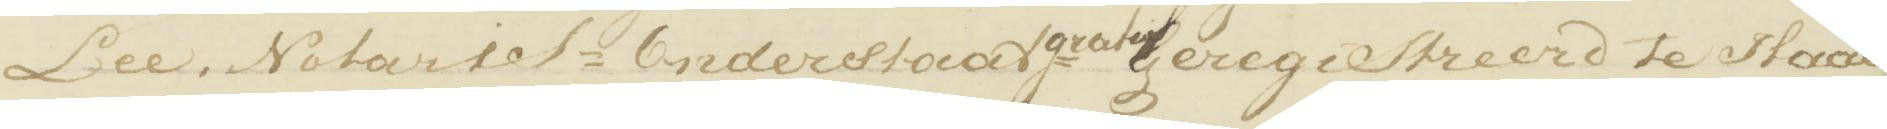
Lee, Notaris = Onderstaat = gratis Geregistreerd te Haar
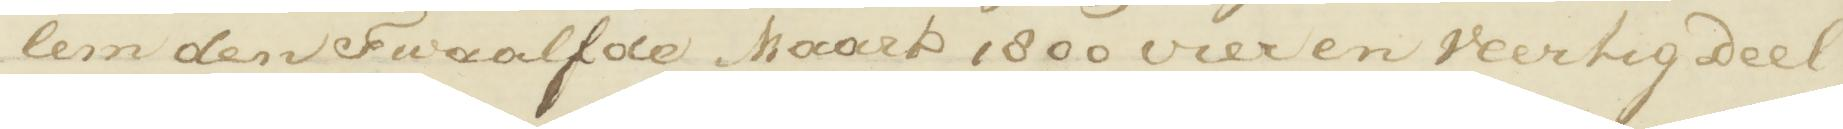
lem den Twaalfde Maart 1800 vier en Veertig deel
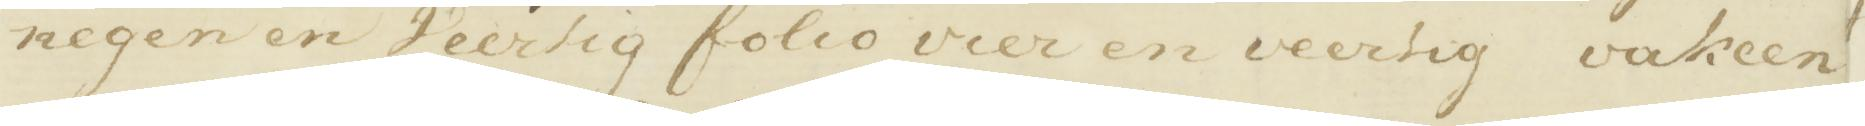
negen en Veertig folio vier en veertig vak een
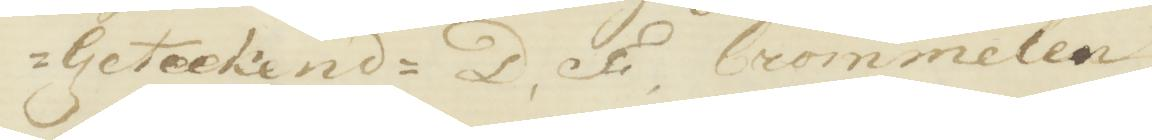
= Geteekend = D, F. Crommelen,
